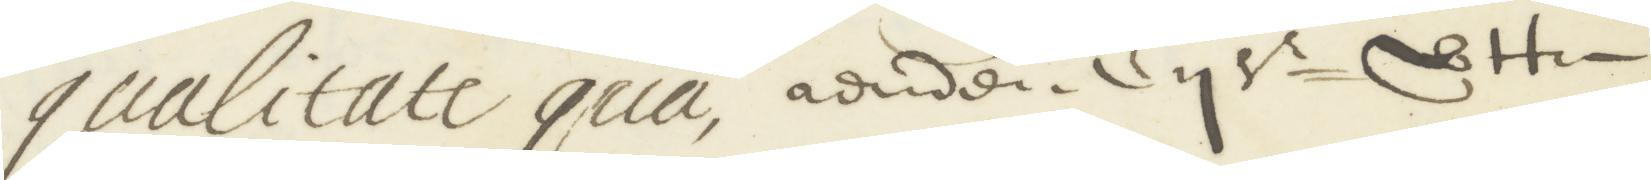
qualitate qua, aenden Eijs=r wte
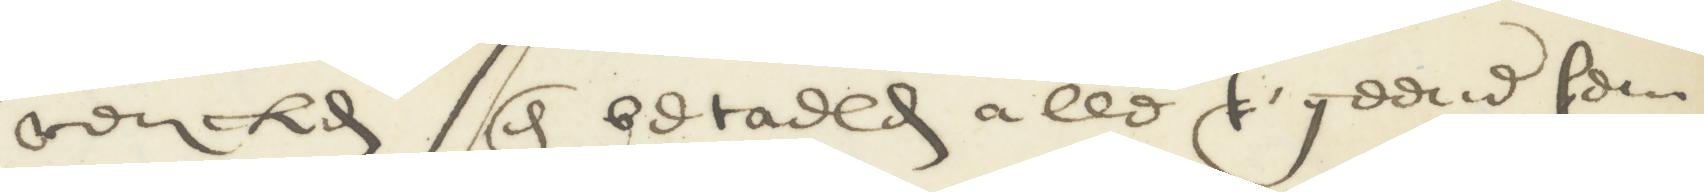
reycken ende betaeld alle t' geene hem
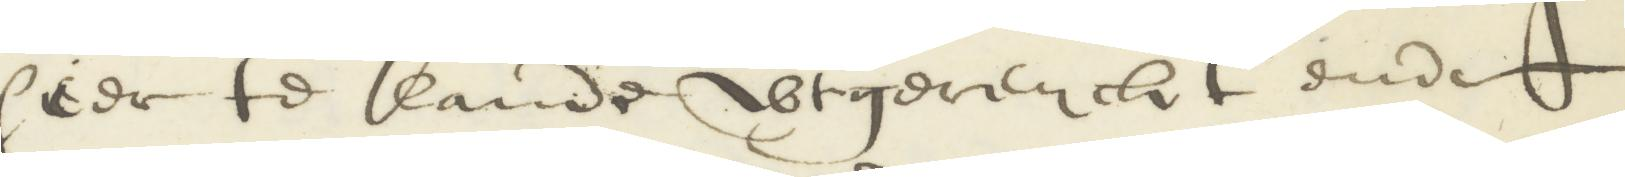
hier te lande wtgereyckt ende
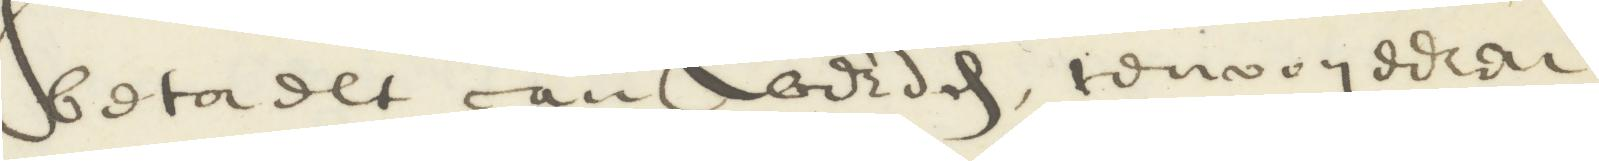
betaelt can werden, tenvooyeeren
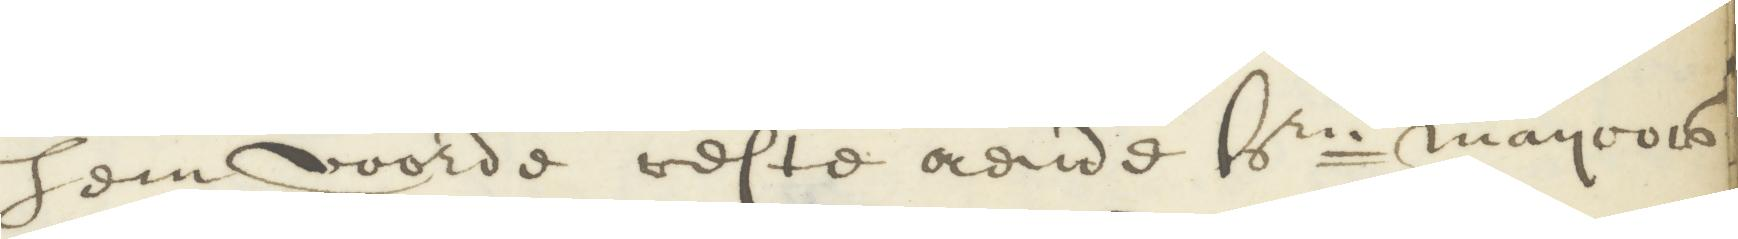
hem voorde reste aende H=rn mayoors
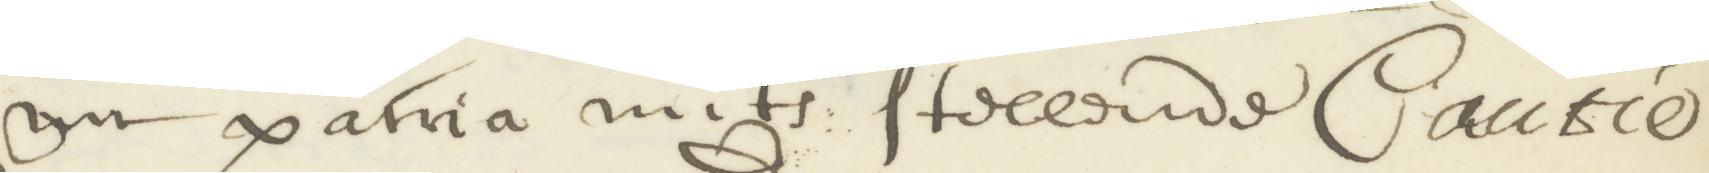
int patria mits stellende Cautie
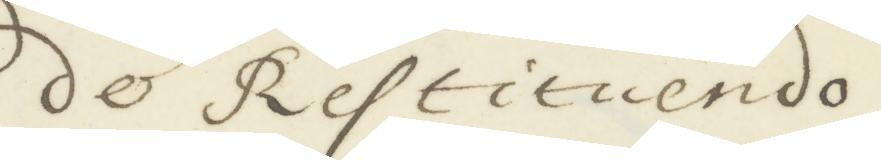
de Restituendo
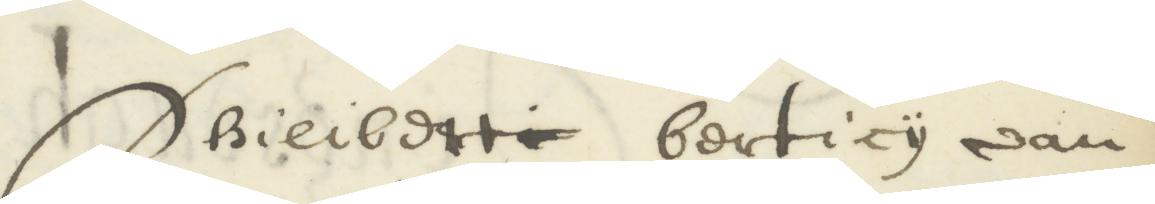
Philibert berticij van
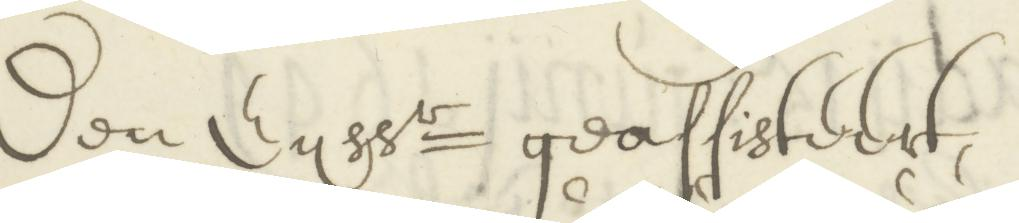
Den Eyss=r geassiteert
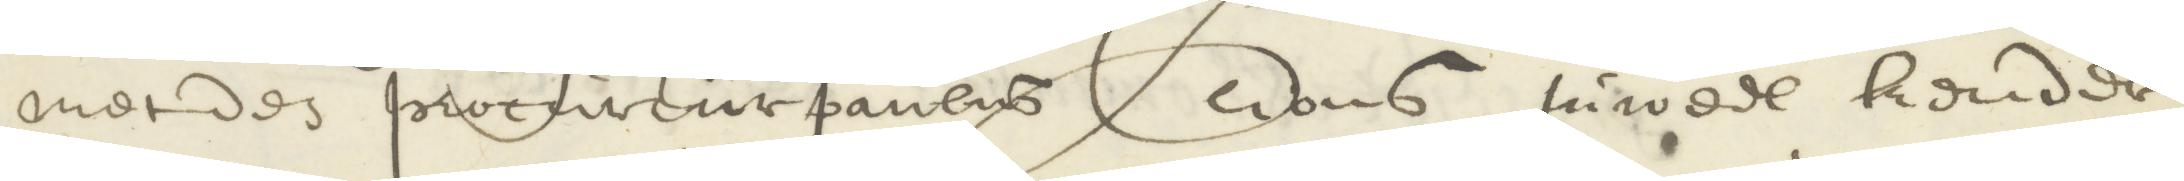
met den procureur paulus ons juweel kender
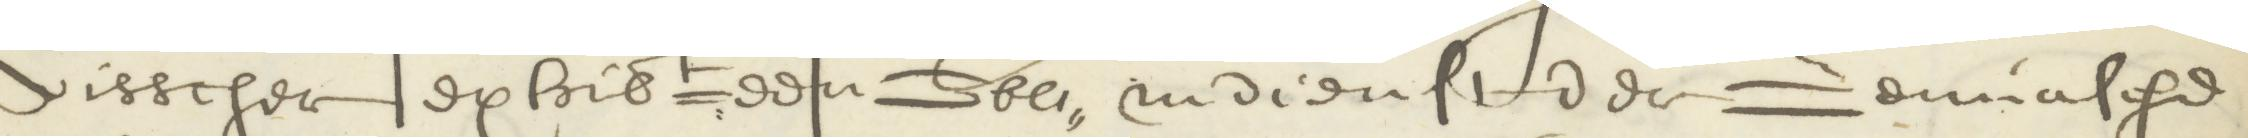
Visscher exhib=t een Obl„ in dienst der Cemiasche
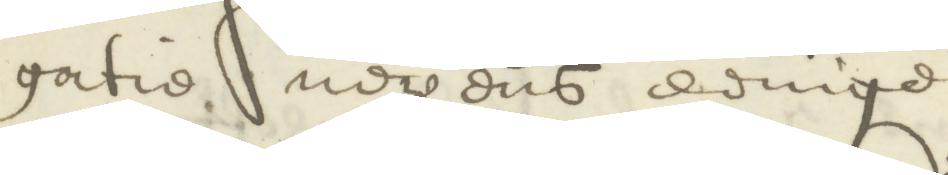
gatie nevens eenige
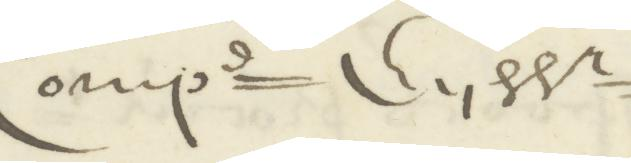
Comp=e Eyss=r
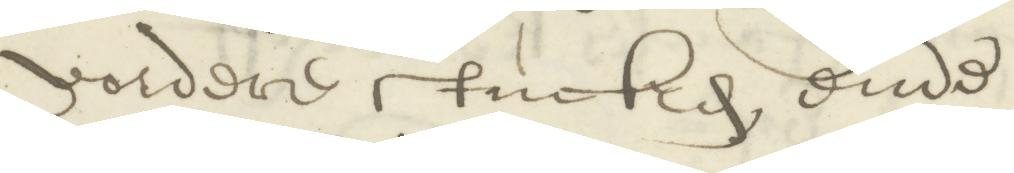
vordere stucken ende
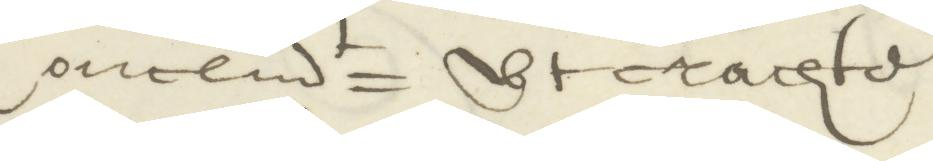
Conclud=t wt crachte
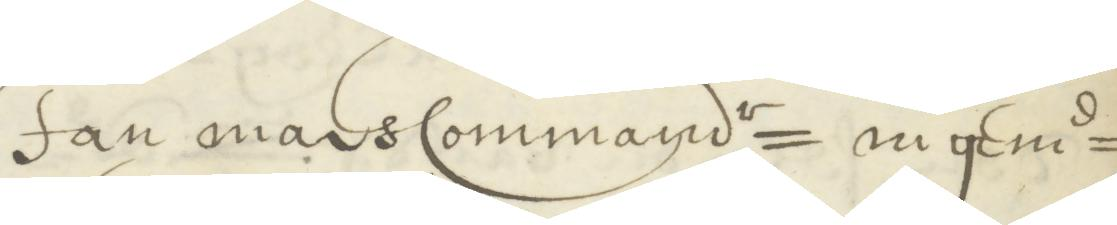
Ian maes Command=r in gem=e
